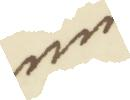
mm
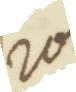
ro
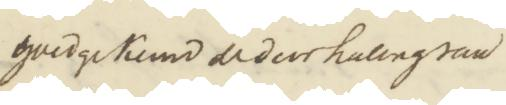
goedgekeurd de doorhaling van
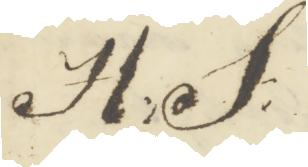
H: S:
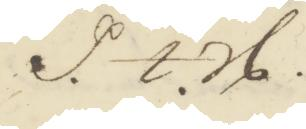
J. t. H.
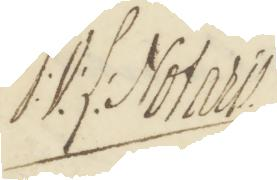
P:V:L: Notaris.
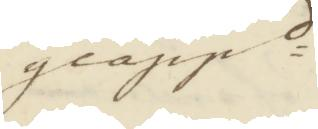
geapp=d
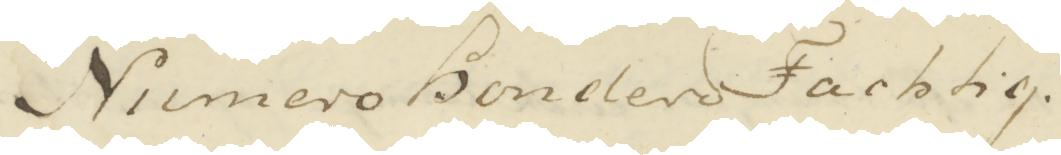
Numero Honderd Tachtig.
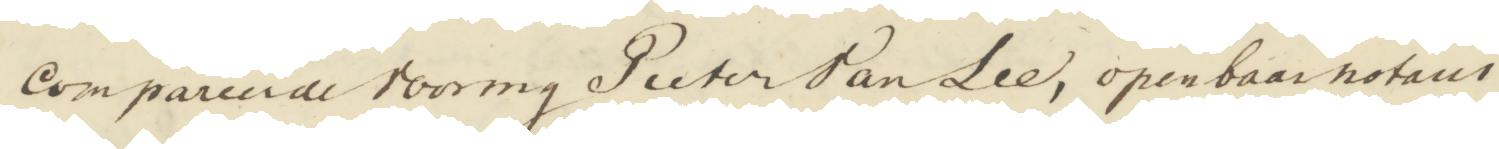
Compareerde voor mij Pieter van Lee, openbaar notaris
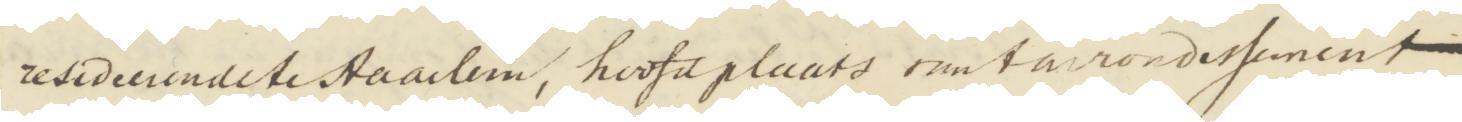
resideerende te Haarlem, hoofdplaats van t arrondissement
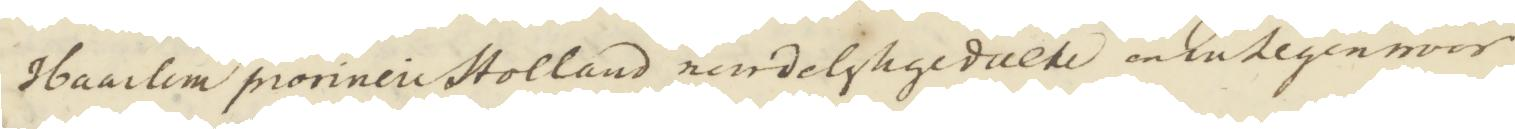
Haarlem provincie Holland noordelykgedeelte en integenwoor
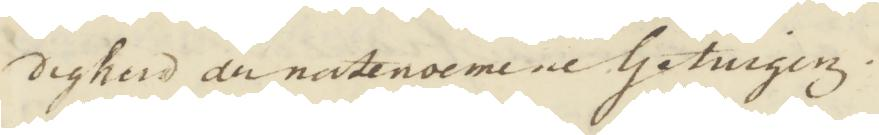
digheid den natenoemene Getuigen
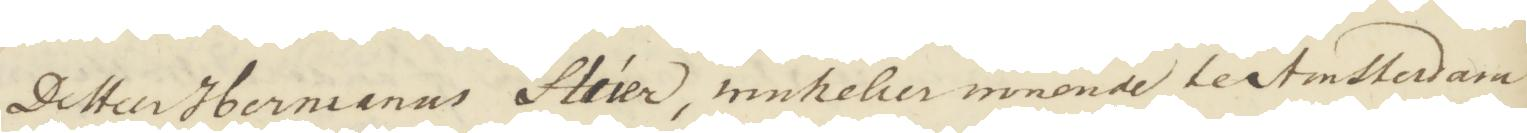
De Heer Hermanus Stuer, winkelier wonende te Amsterdam
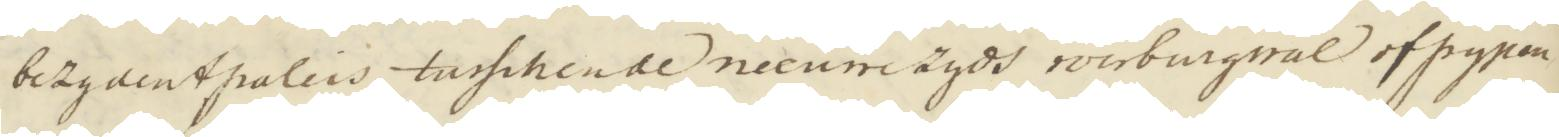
bezyden t paleis, tusschen de nieuwe zyds voorburgwal of pypen
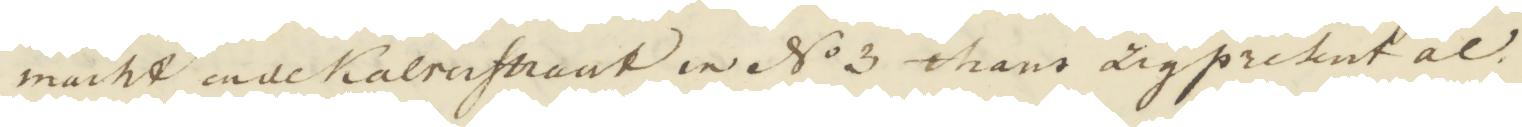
markt en de Kalverstraat in No 3 thans zig present al
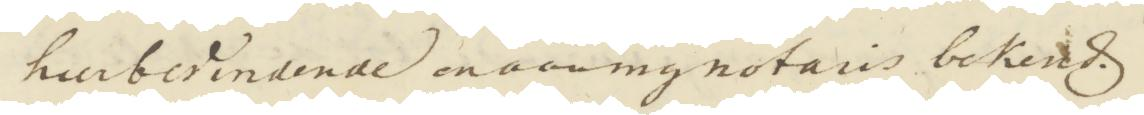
hier bevindende en aan my notaris bekend.
